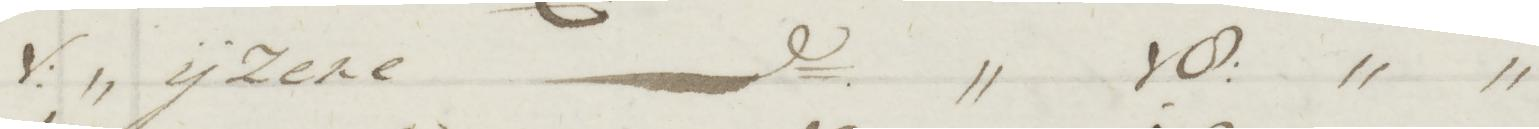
1: „ ijzere _=o „ 18: „ „
